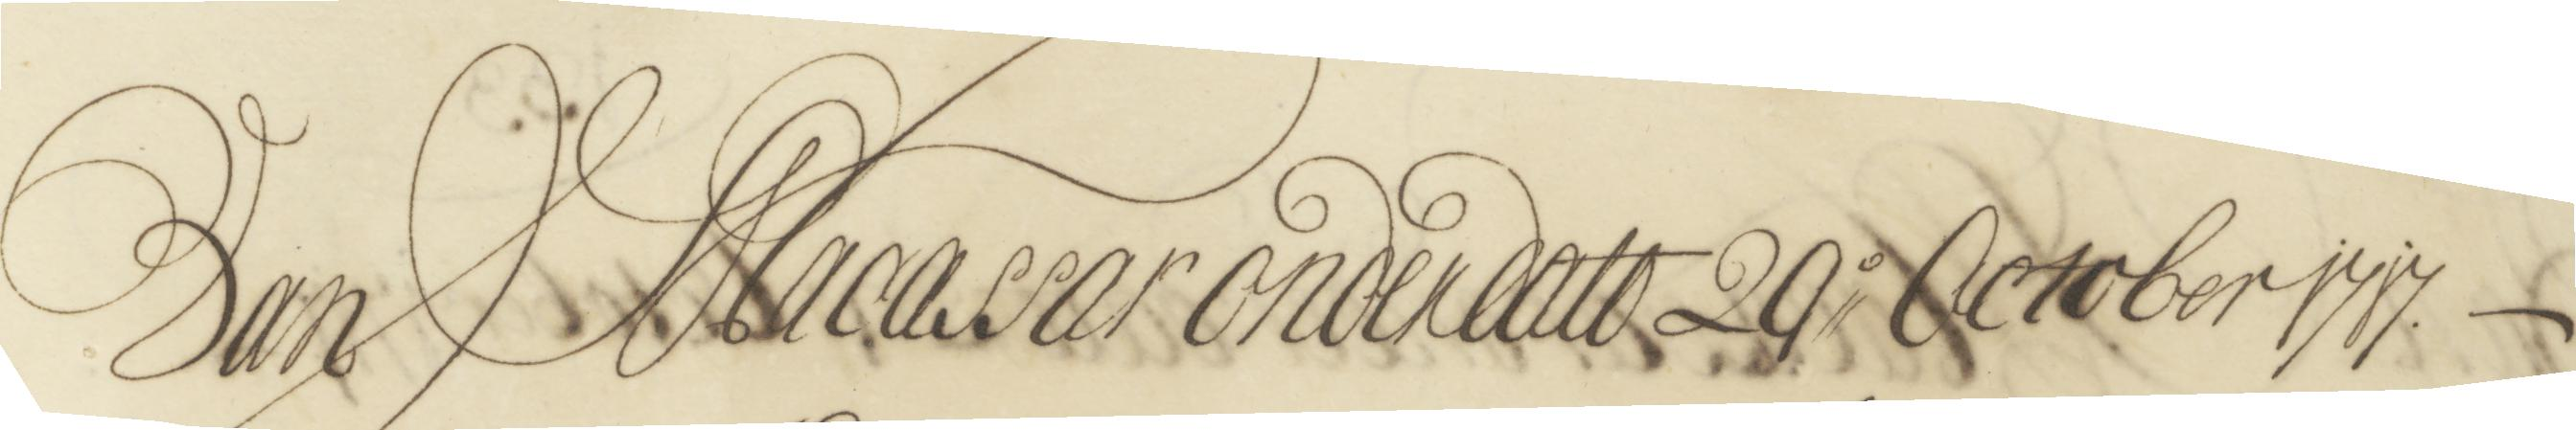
Van Macassar onder dato 24„e October 1717.—
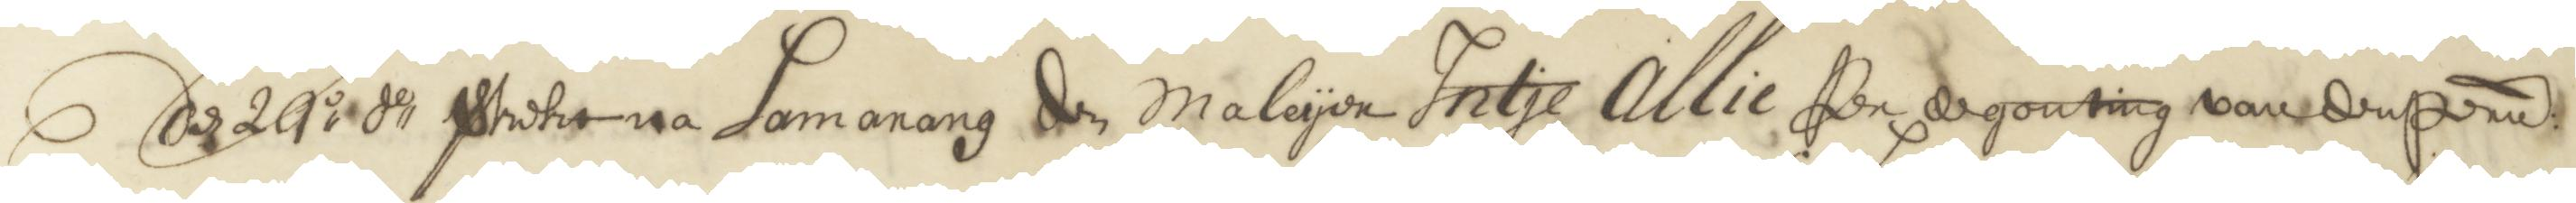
den 24e d„o vertrekt na Samarang den Maleijer Intje Allie Per de gonting van den Pere:
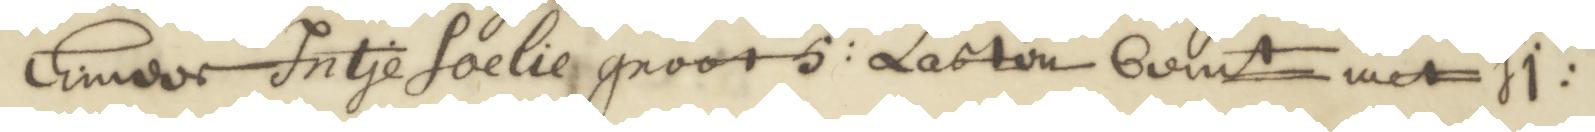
chinees Intje Soelie groot 5: Lasten bem=t met 11:
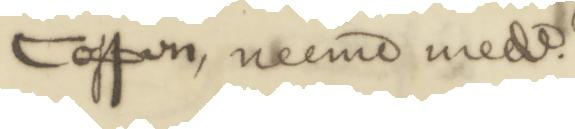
Coppen, neemd mede:
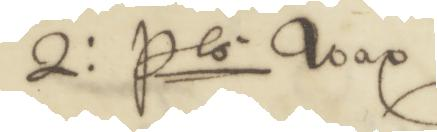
2: p=ls wax
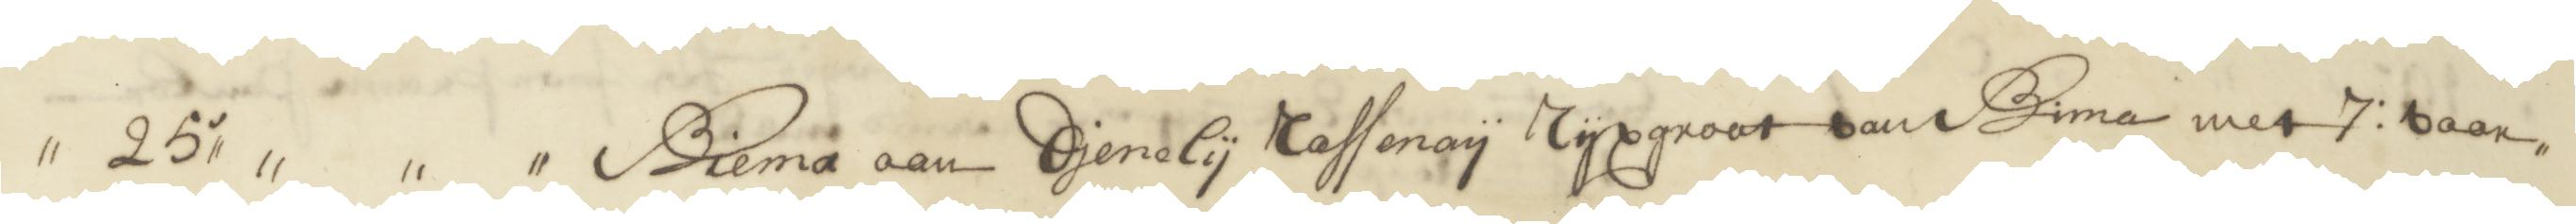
„ 25„' „ „ „ Biema aan djenalij rassenaij rijxgroot van Bima met 7: vaar„
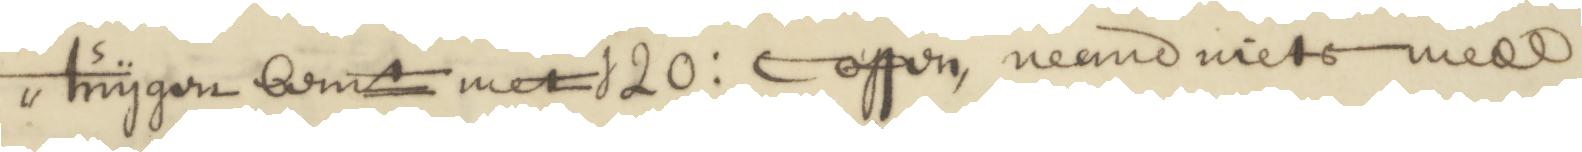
„tuijgen bem=t met 120: coppen, neemd niets mede
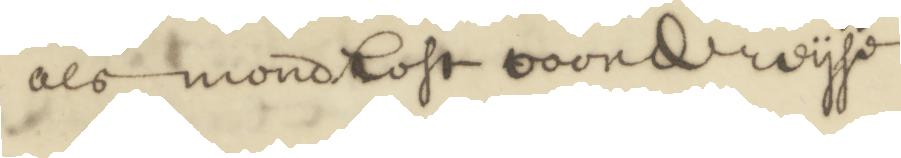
als mondkost voor de reijse
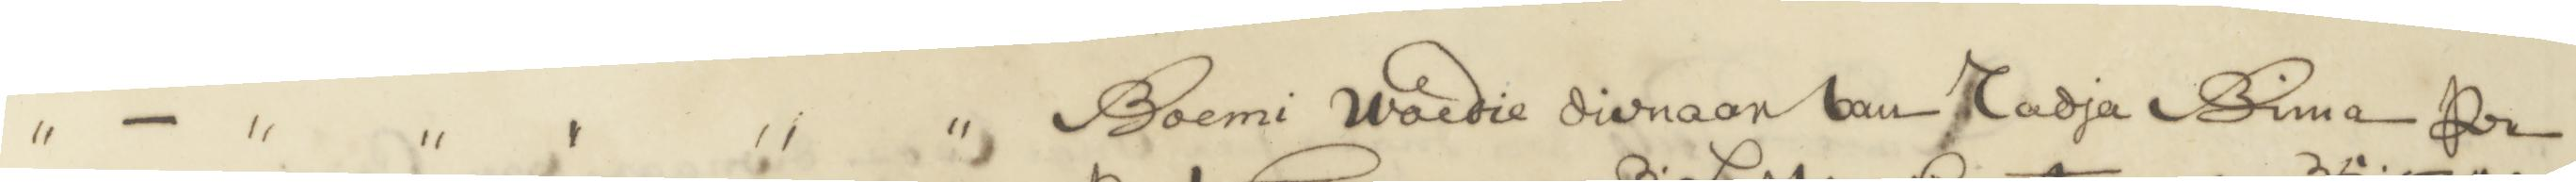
„ — „ „ „ „ „ Boemi woedie dienaar van Radja Bima Per
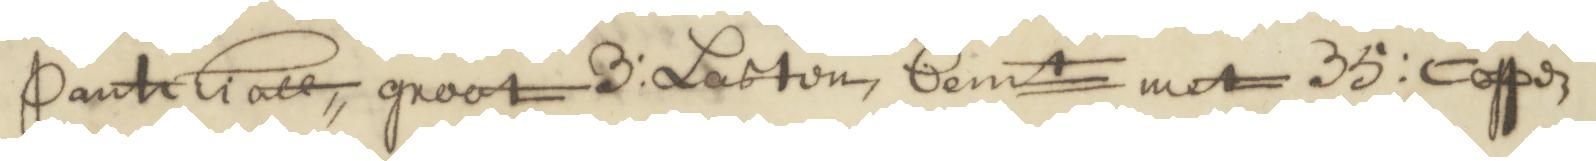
Pantchiall„ groot 3: Lasten, bem=t met 35: Coppen
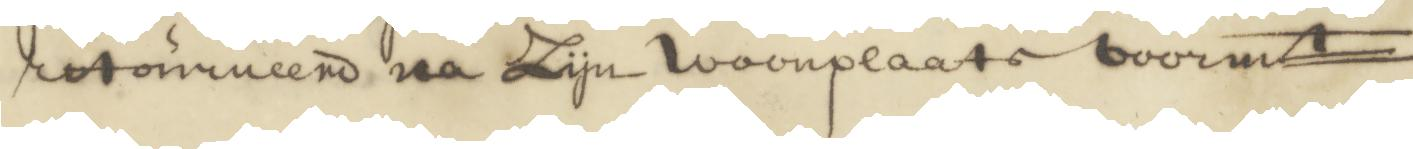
retourneerd na zijn woonplaats voorm=t
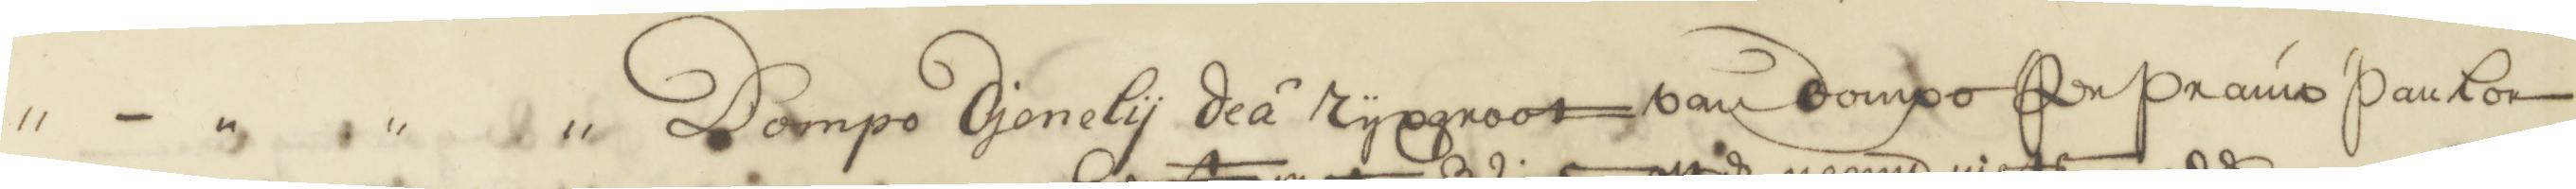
„ — „ „ „ Dampo djenelij dea Rijxgroot van dompo Per Prauw Pankor
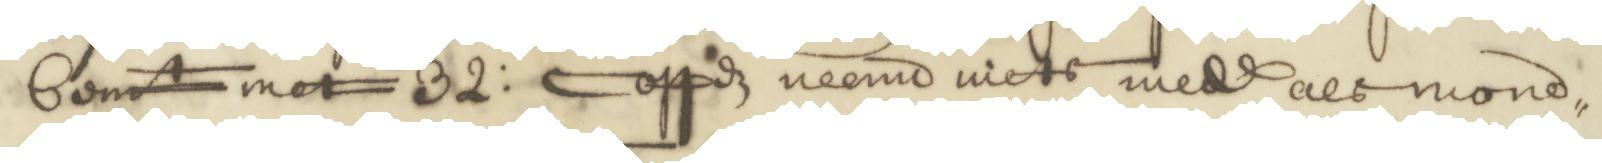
bem=t met 32: coppen neemd niets mede als mond„
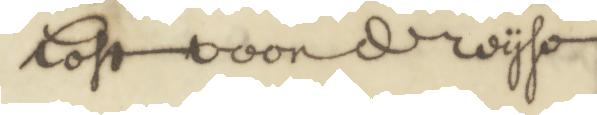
kost voor de reijse
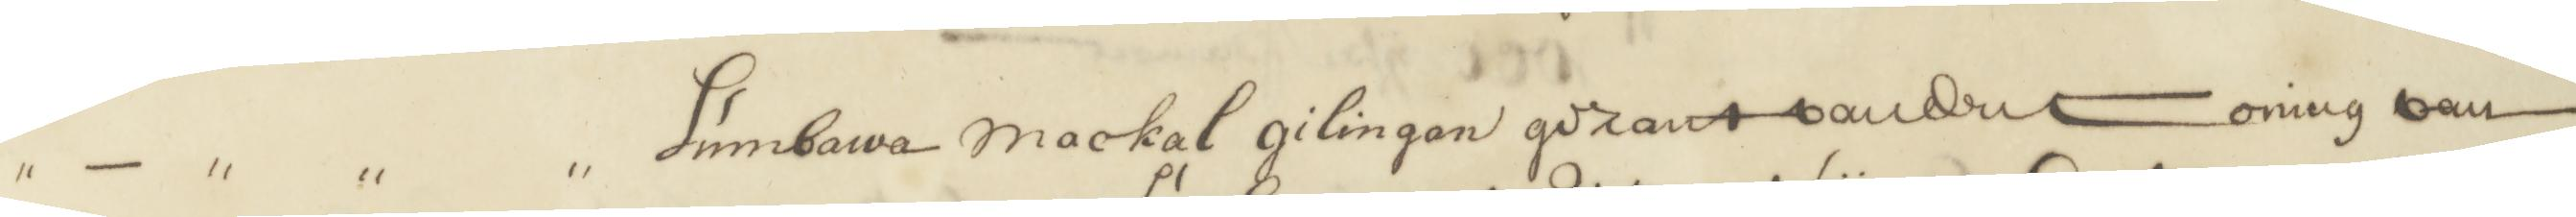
„ — „ „ „ Sumbawa mackal gilingan gezant vanden Coning van
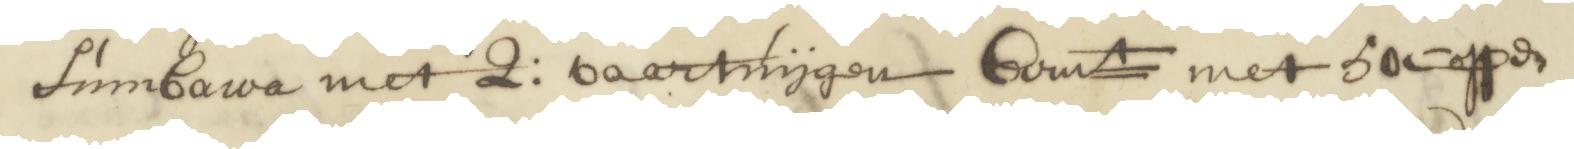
Sumbawa met 2: vaartuijgen bem=t met 50 coppen
